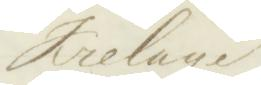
Krelage
